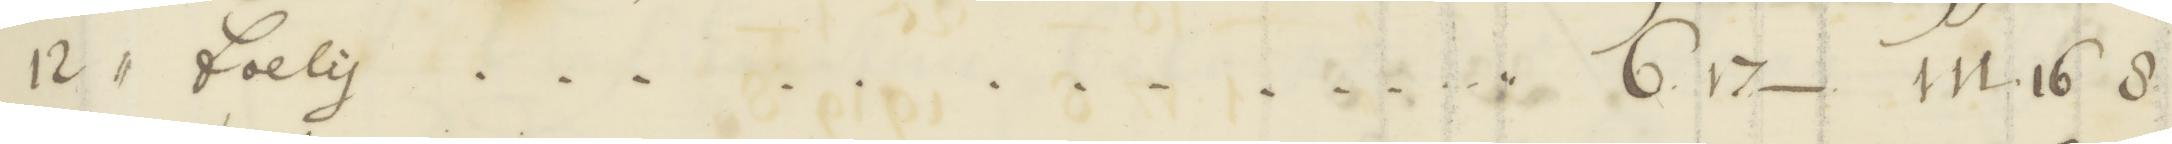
12 „ foelij . . . . . . . . . . . . . „ 6. 17—. 111:16 8
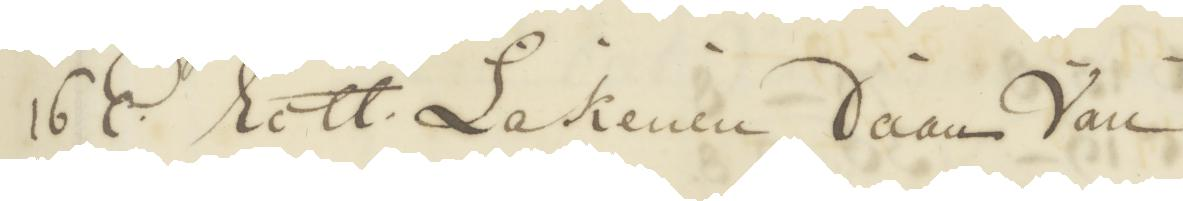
16 E: holl: Lakenen daar van
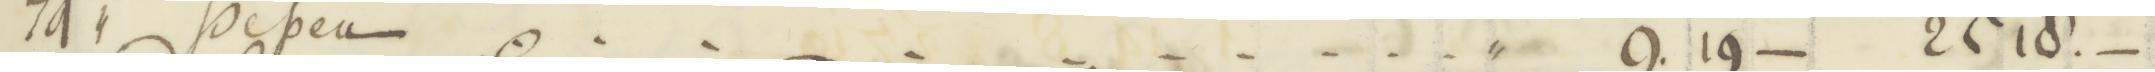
74 „ Peper . . . . . . . . . . „ 9.19 — 2518.—
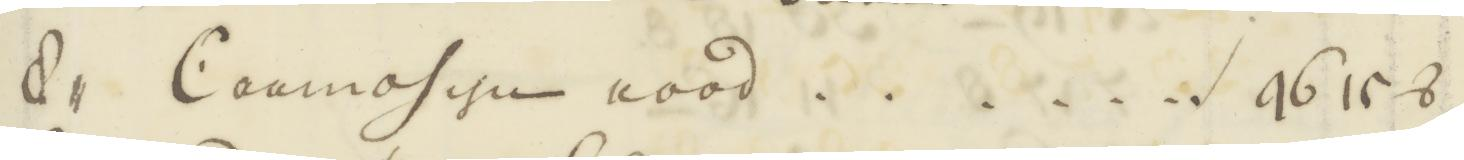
8„ Cormosijn rood . . . . . . ƒ 46 15 8
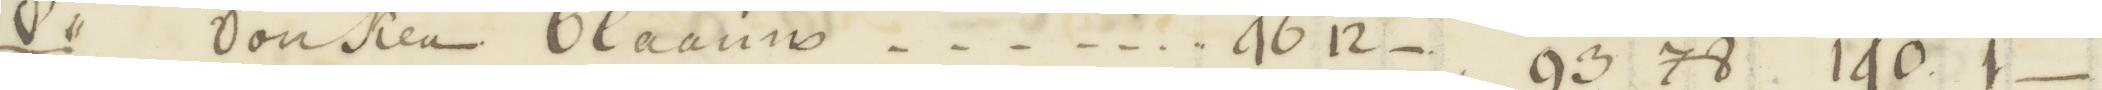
8„ donker blaauw - - - - - . „ 46 12 —, 93 78 140. 1—
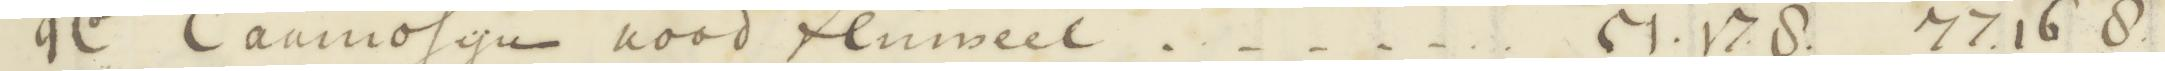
4@ Carmosijn rood fluweel . . - - - - . . . 51.17.8. 77.16 8.
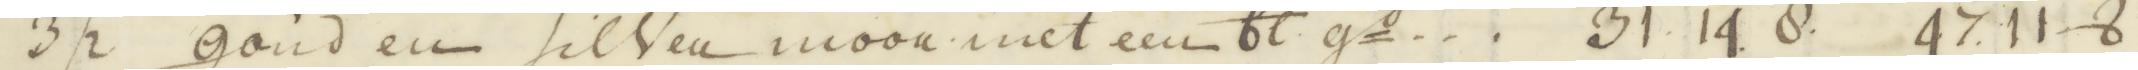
3½ goud en silver moor met een bl g=d - - . 31. 14. 8. 47.11 8
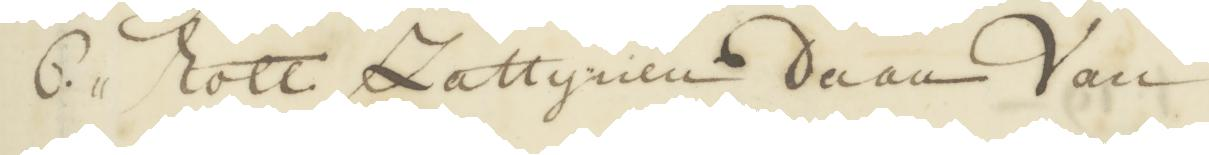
6. „ holl. Zattyrien daar Van
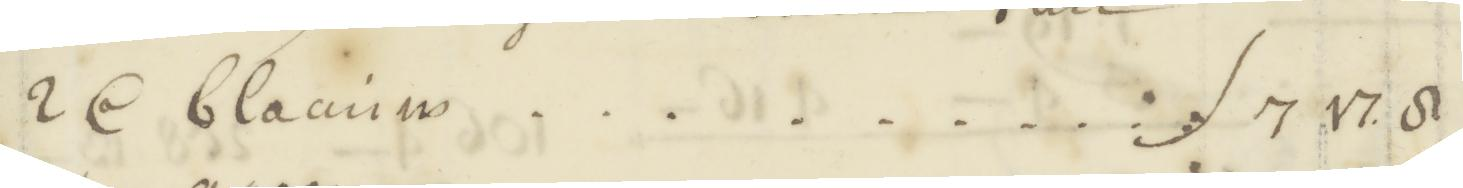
2 @ blaauw . . . . . . . . . .ƒ 7 17. 8
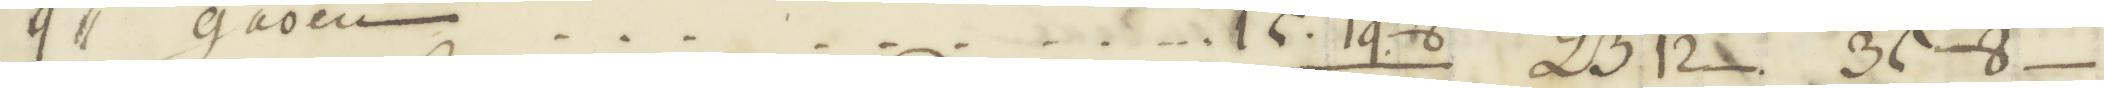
4 „ groen . . . . . . . . . . . 15. 14. 8 23 12—. 35 8—
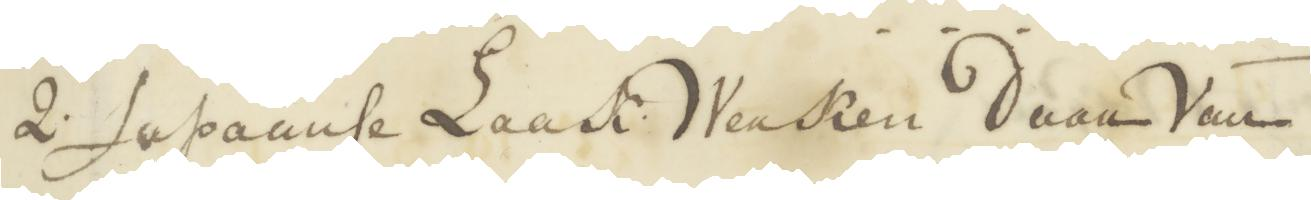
2 Japaanse Laak: Werken daar van
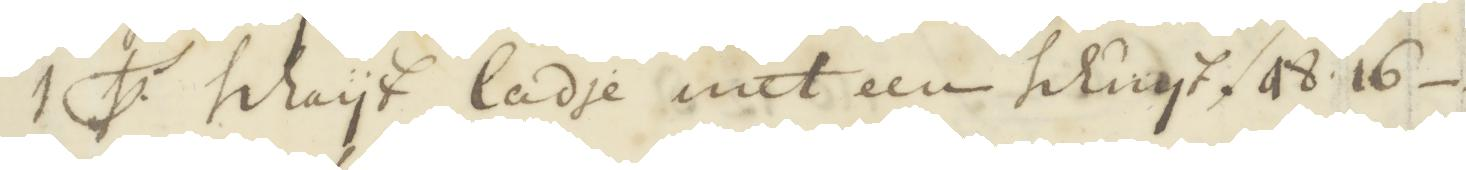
1 p.s schrijf ladje met een schuyt ƒ48 16 —
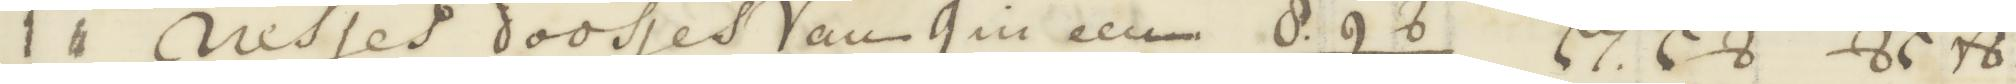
1 „ nesjes doosjes van 4 in een. 8. 9 8 57. 58 85 15
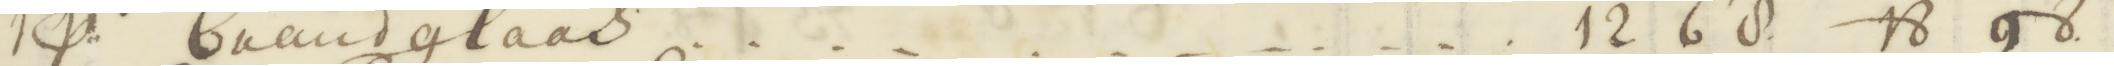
1 p.s brandglaas . . . . . . . . . . . . 12. 6 8. 18 98.
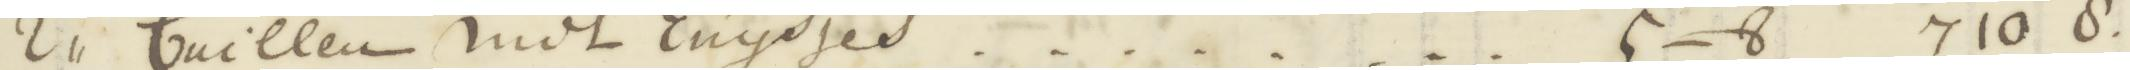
2 „ brillen met huysjes . . . . . . . . 5— 8 7 10 8.
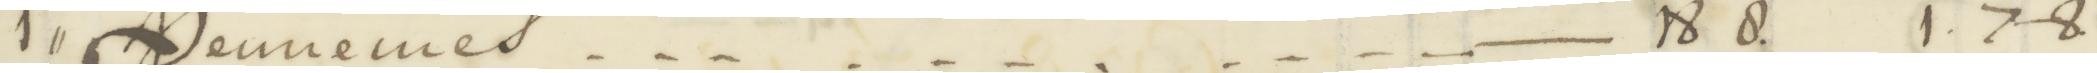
1 „ Pennemes - - - . - - . - - - - — 18 8. 1. 7 8.
